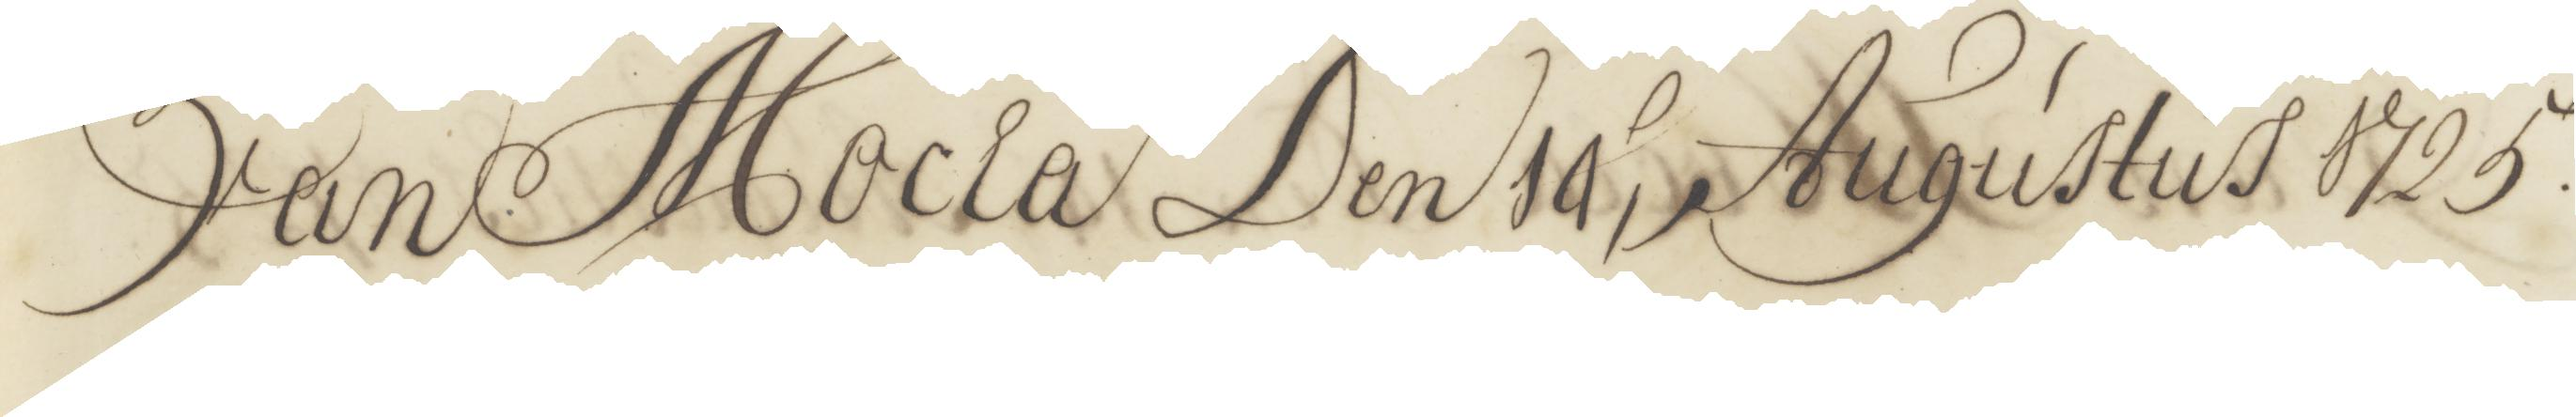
Van Mocha Den 14„' Augustus 1725
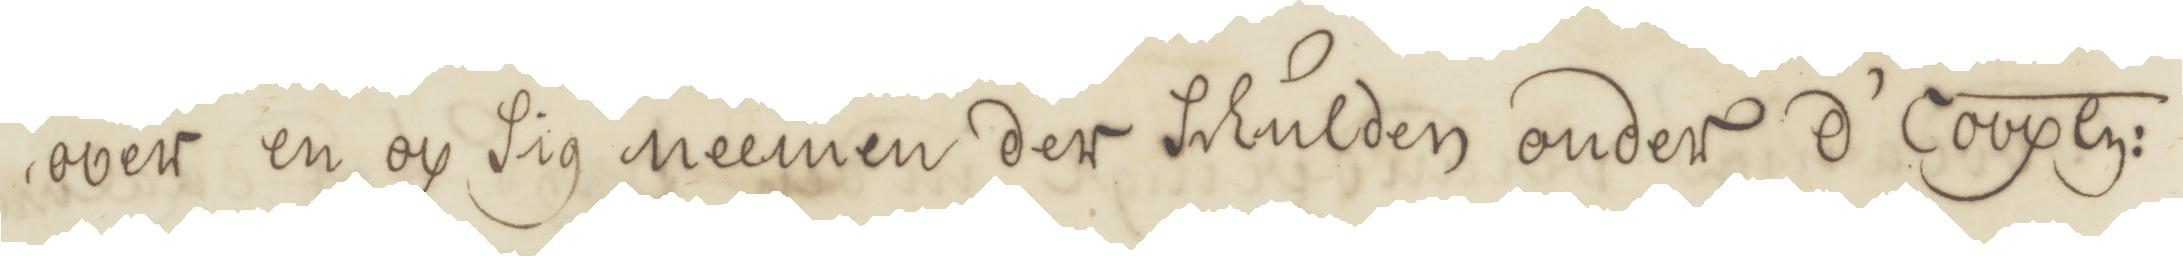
over en op sig neemen der schulden onder d’ Coopln:
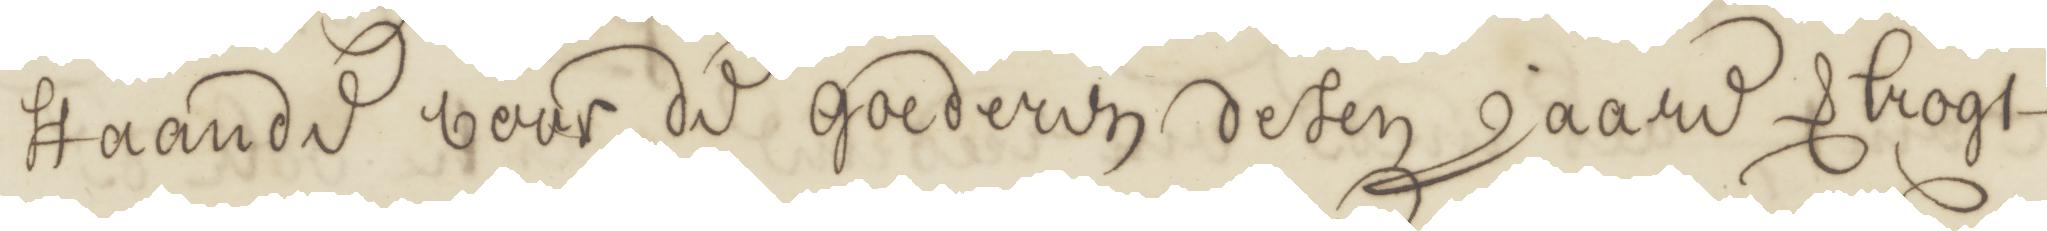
staande voor de goederen desen jaare verkogt
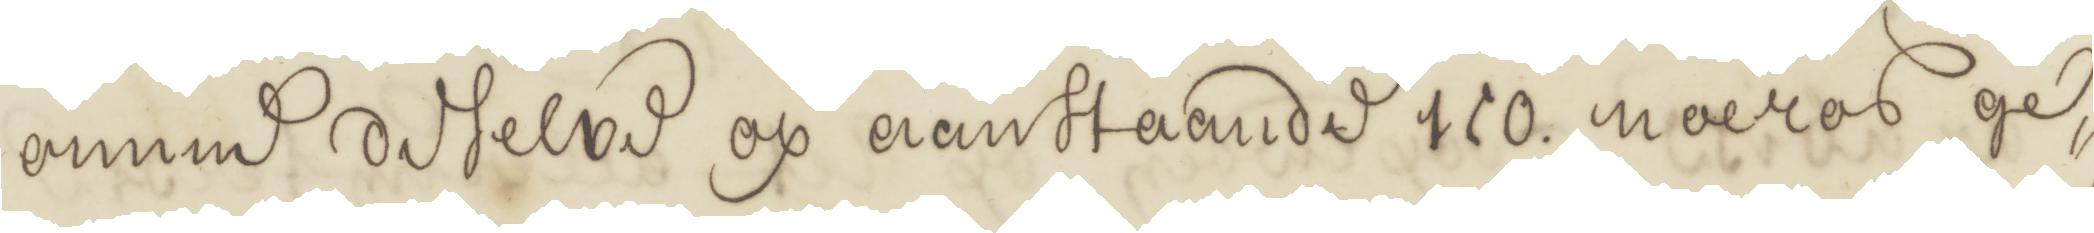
omme deselve op aanstaande 150. noeros ge„
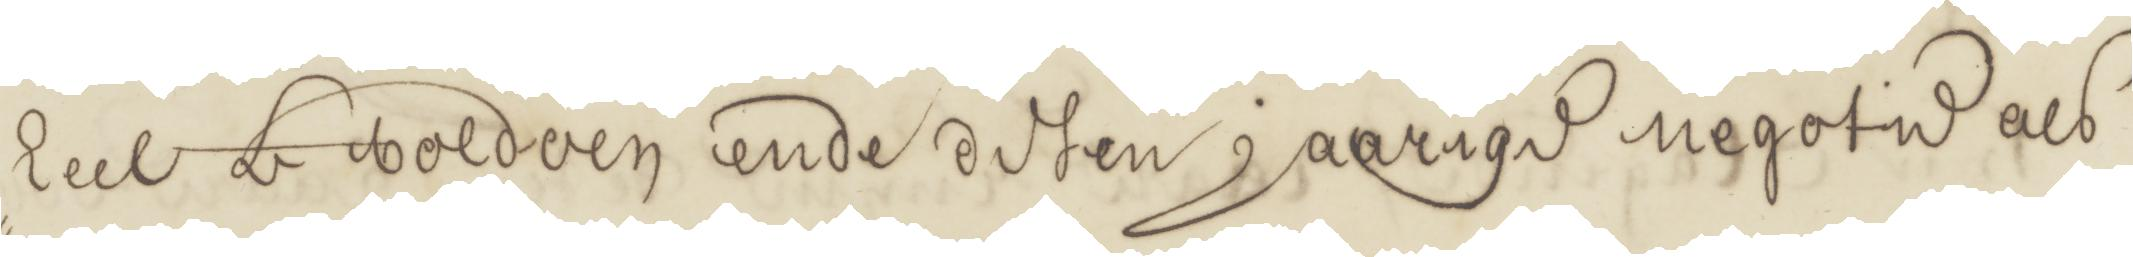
„heel te voldoen ende desen jaarige negotie als
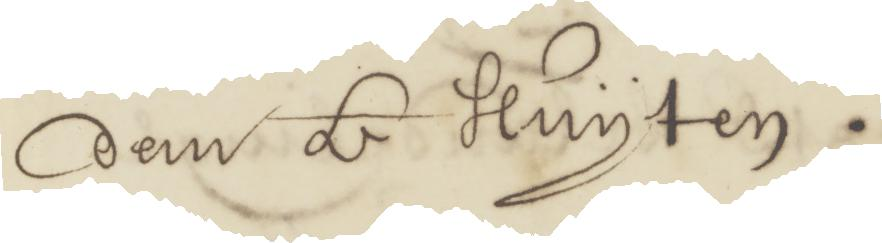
dan te sluijten.
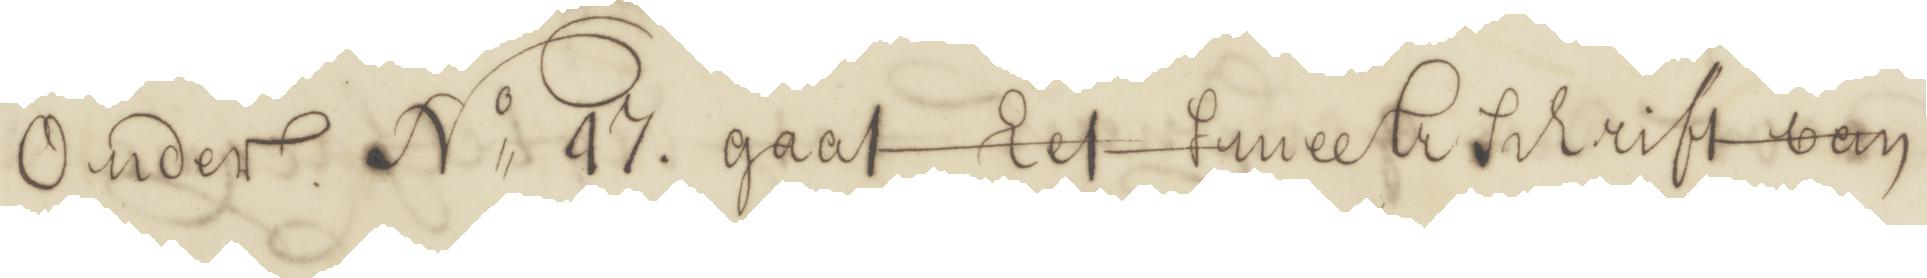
Onder N„o 47. gaat het smeek schrift van
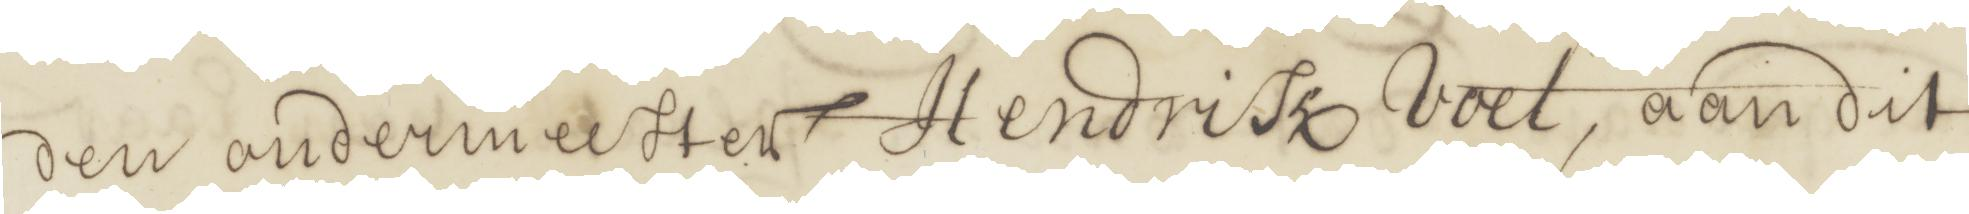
den ondermeester Hendrik Voet, aan dit
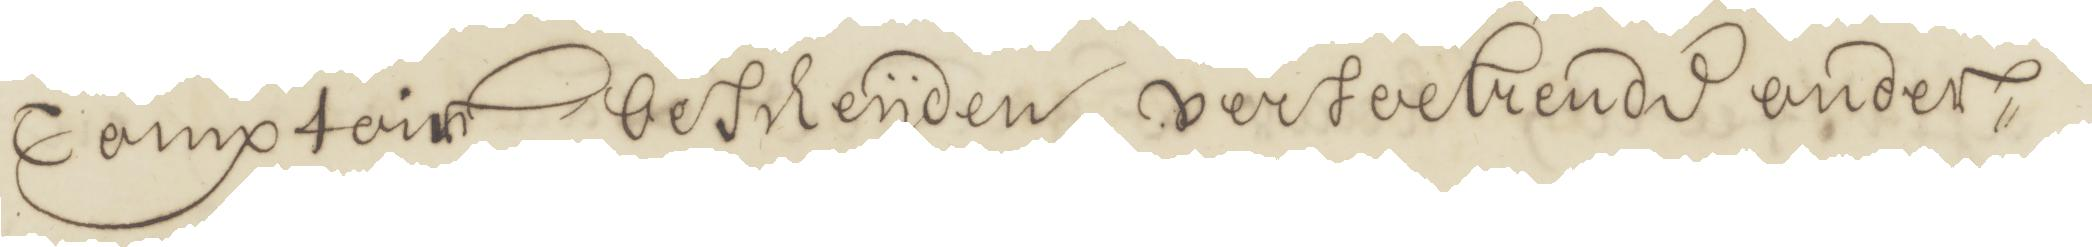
Comptoir bescheijden, versoekende onder„
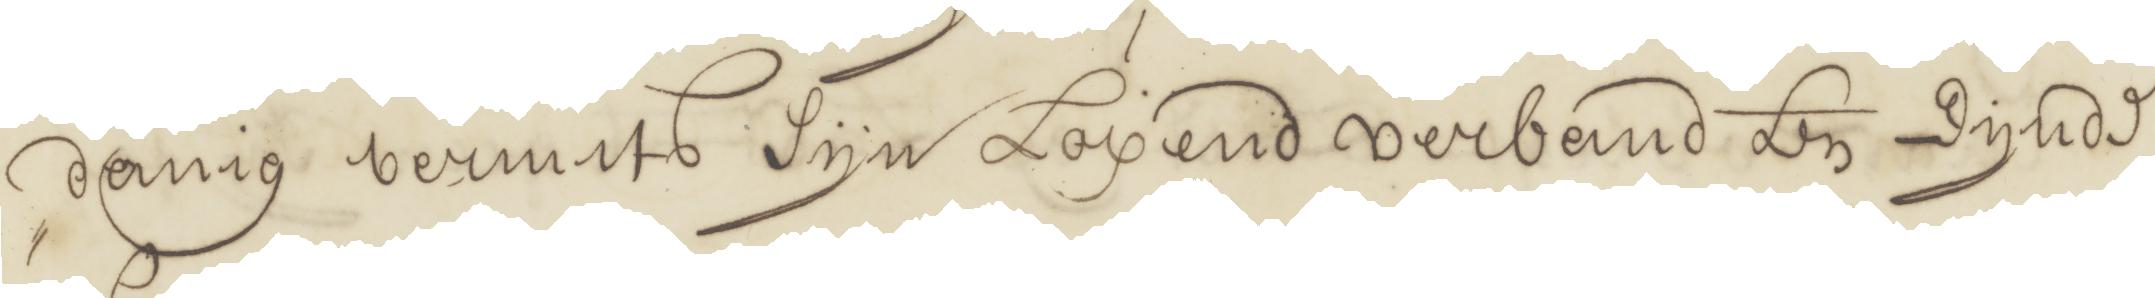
„danig vermits sijn Lopend verband ten Eijnde
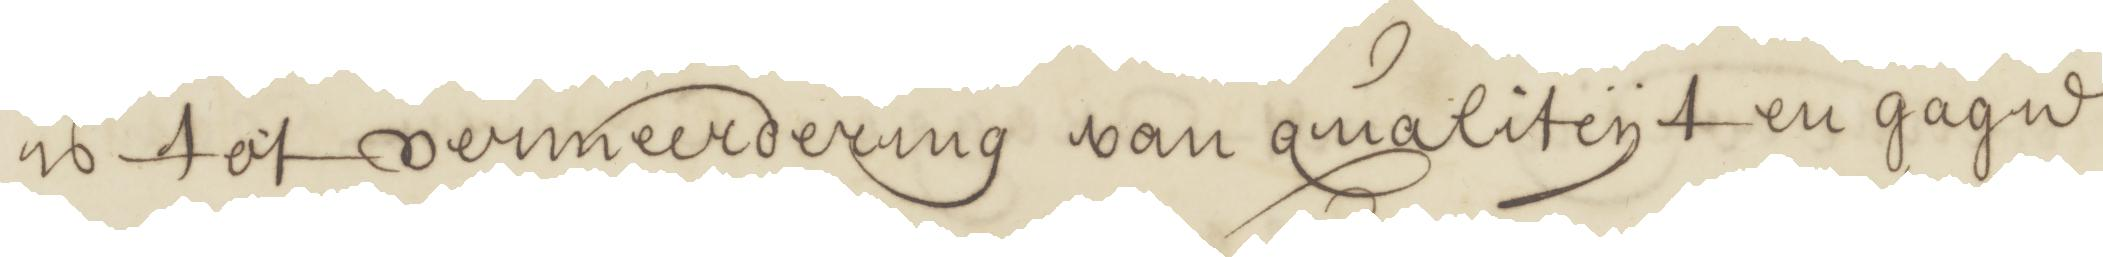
is tot vermeerdering van qualiteijt en gagie
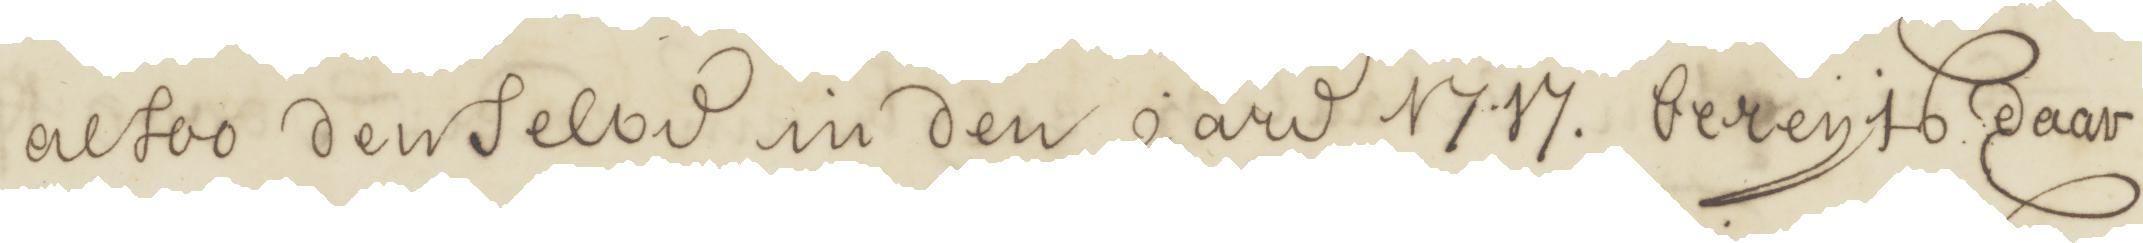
alsoo denselve in den jare 1717. bereijts daar
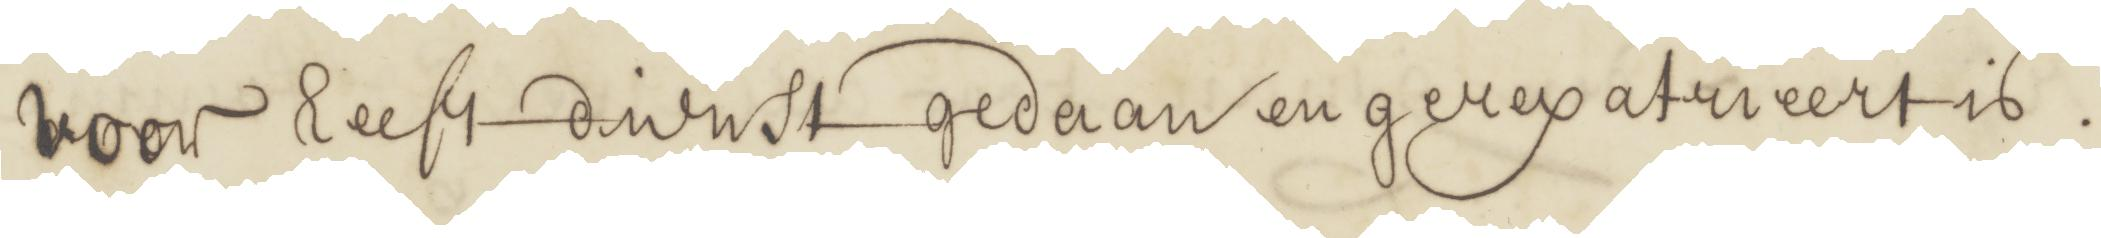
voor heeft dienst gedaan en gerepatrieert is
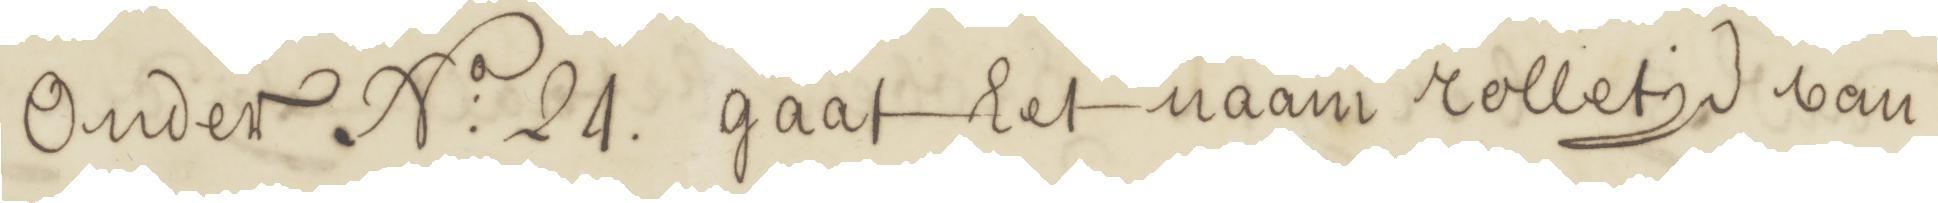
Onder N:o 24. gaat het naam rolletje van
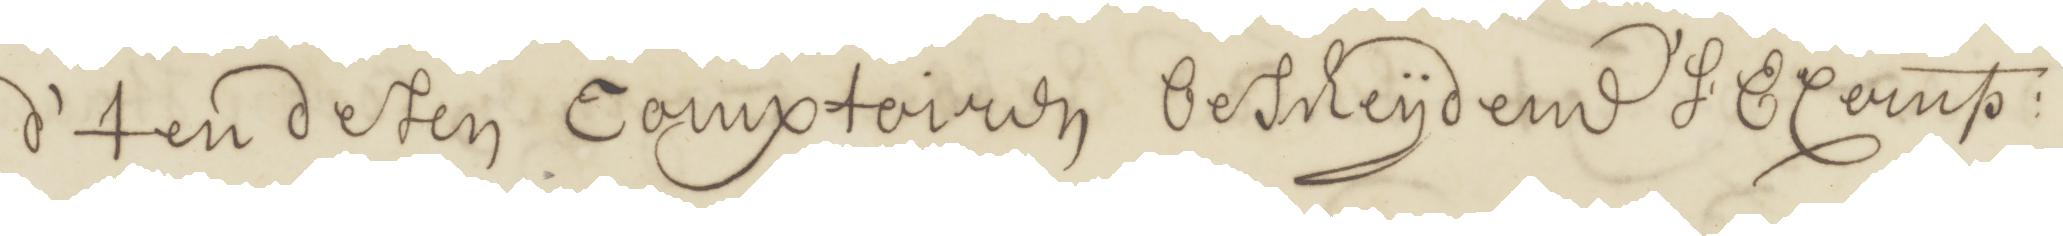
d’ ten desen Comptoiren bescheijdene 's E Comp:
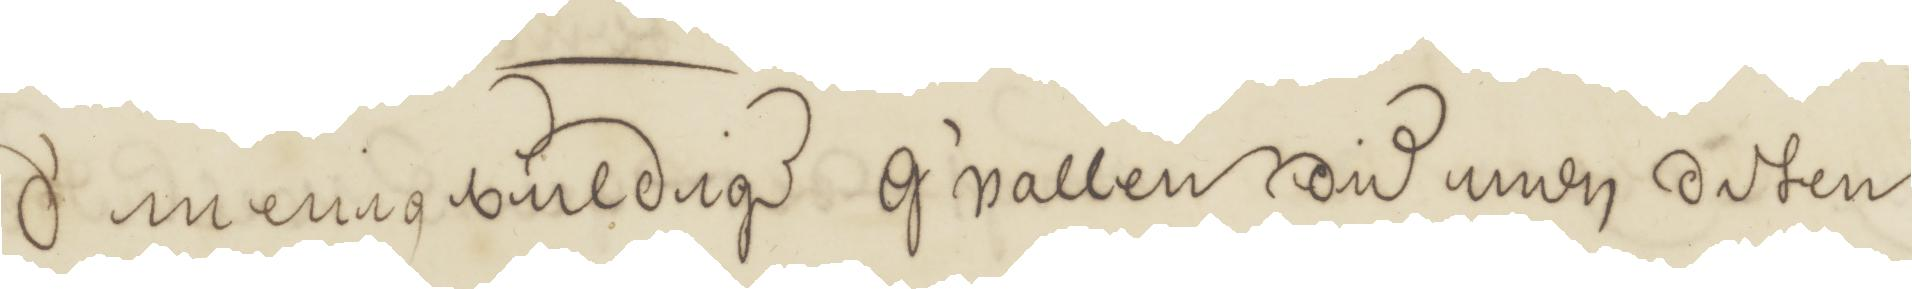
d' menigvuldige g’vallen die men desen
